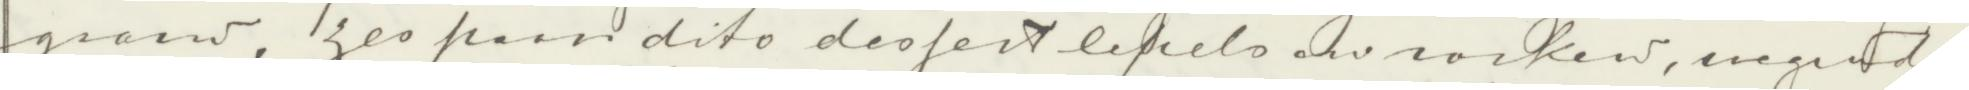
gram, zes paar dito dessert lepels en vorken, wegende
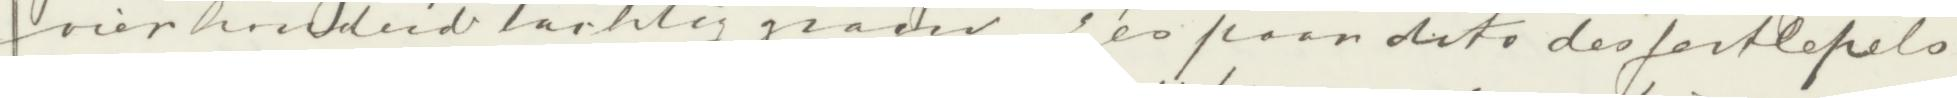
vierhhonderd tachtig gradm, zes paar dito dessertlepels
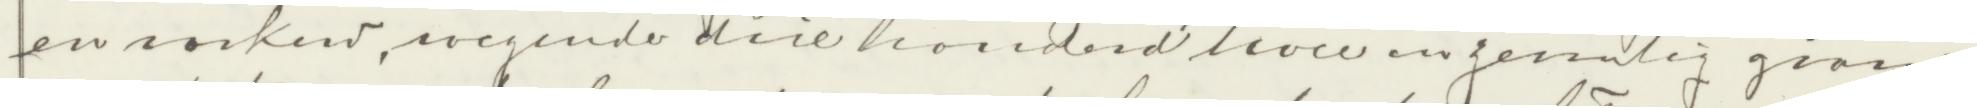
en vorken, wegende drie honderd twee en zeventig gram
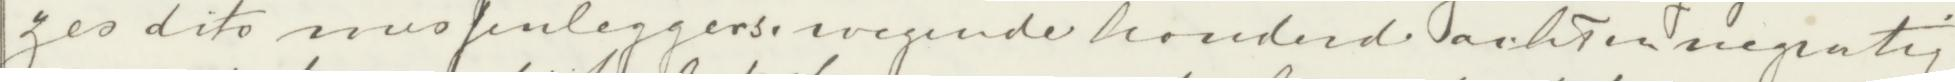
zes dito messenleggers, wegende honderd acht en negentig
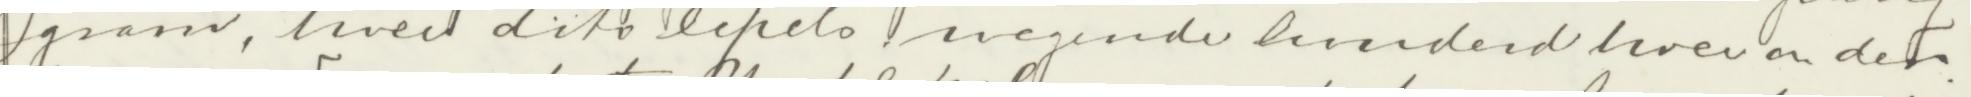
gram, twee dito lepels, wegende honderd twee en der.
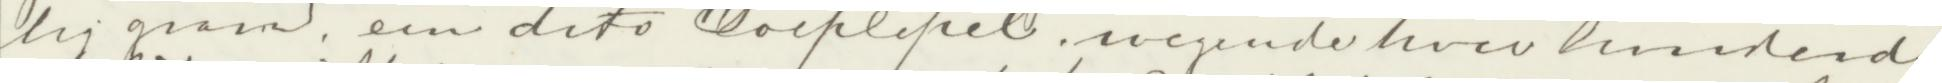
lig gram, een dito soeplepel, wegende twee honderd
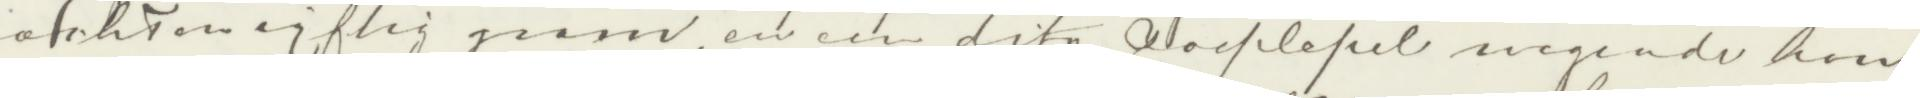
acht en vijftig gram, en een dito soeplepel wegende hon
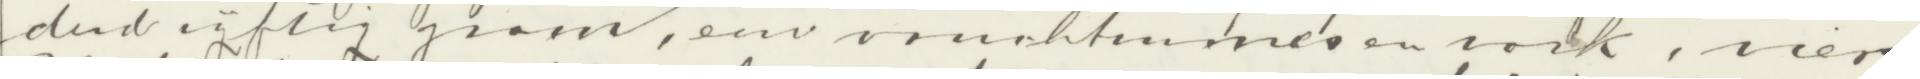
derd vijftig gram, een vruchtenmes en vork, vier
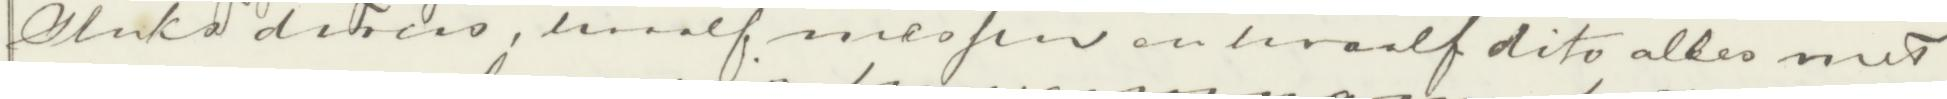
stuks divers, twaalf messen en twaalf dito alles met
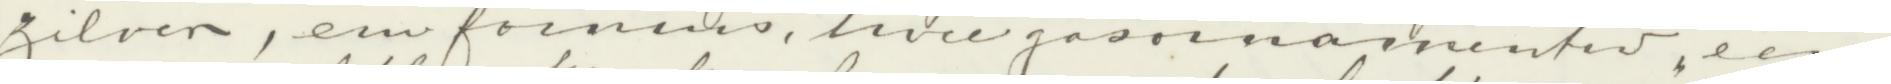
zilver, een fornuis, twee gasornamenten, een
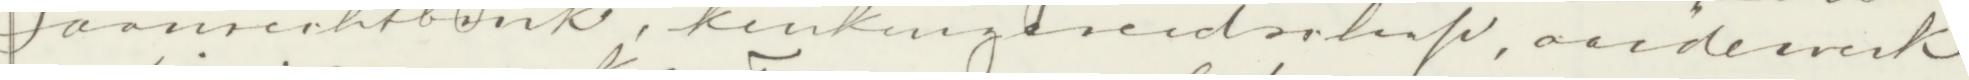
aanrechtbank, keukengereidschap, aardewerk
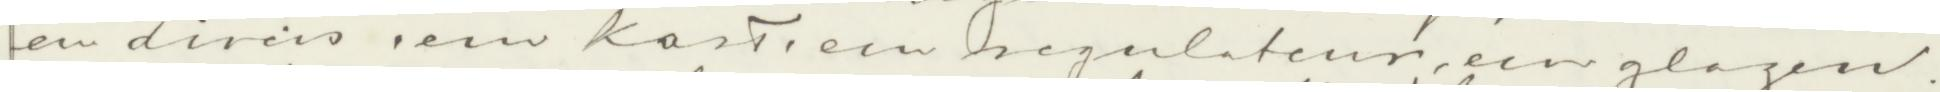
en divers, een kast, een regulateur, een glazen
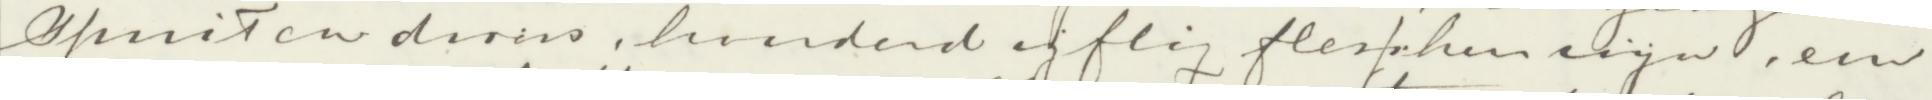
spuit en divers, honderd vijftig flesschen wijn, een
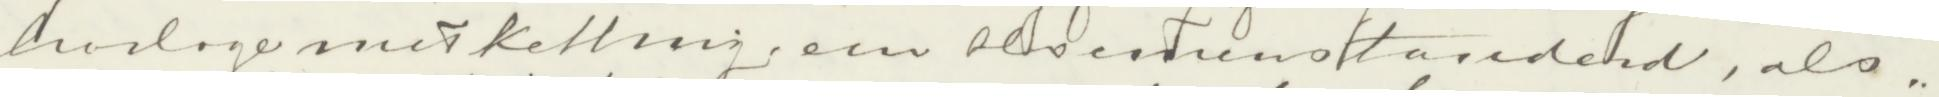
horloge met ketting, een bloemenstanderd, als„
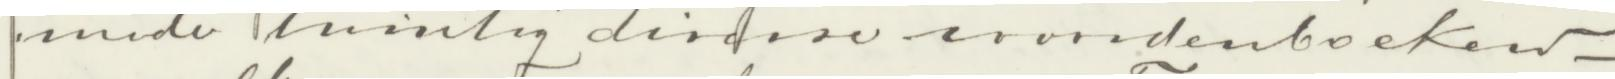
mede twintig diverse woordenboeken-
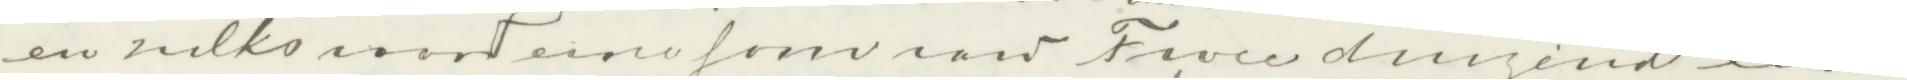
en zulks voor eene som van Twee duizend een
